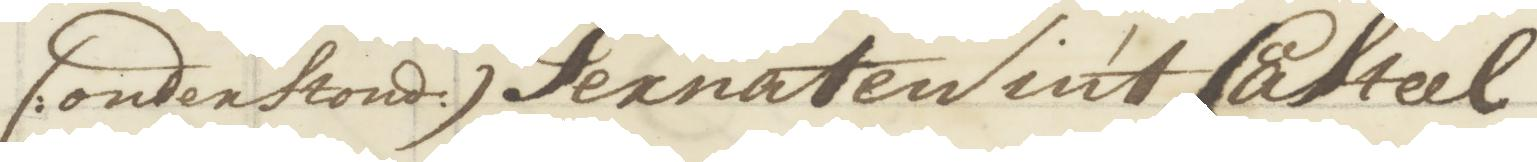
(:onderstond:) Ternaten in’t Casteel
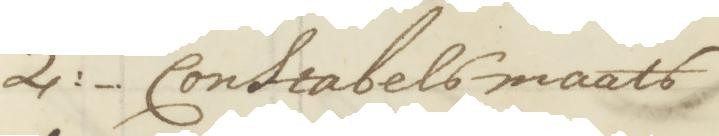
2:–. Constabels maats
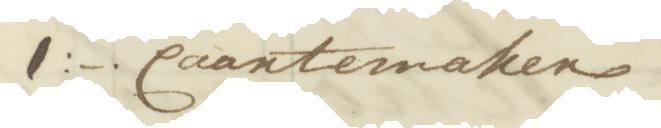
1:–. Caartemaker
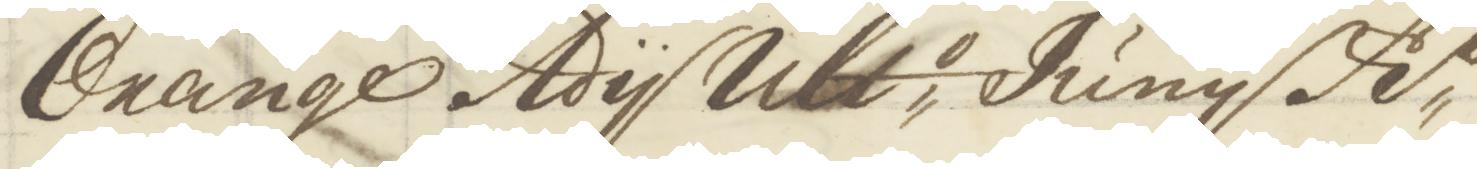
Orange Adij Ult„o Iunij A„o
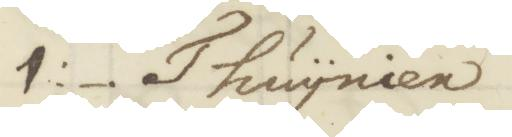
1:–. Thuijnier
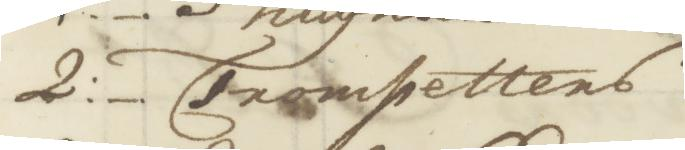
2:–. Trompetters
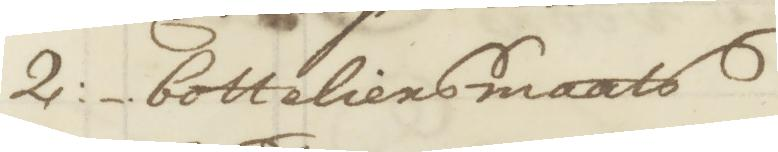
2:–. botteliers maats
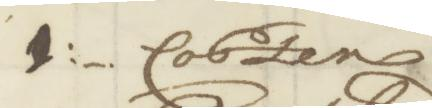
1:–. Coster
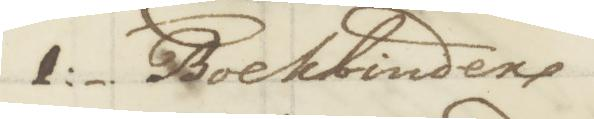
1:–. Boekbinder
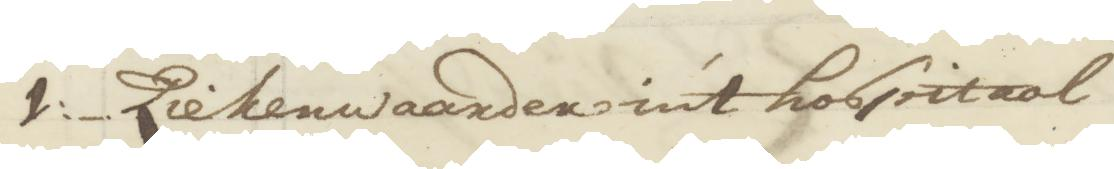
1:–. ziekenwaarder in’t hospitaal
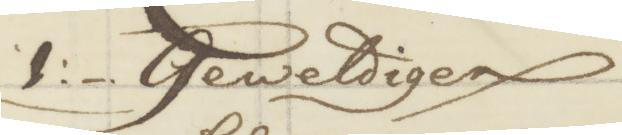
1:–. Geweldigen
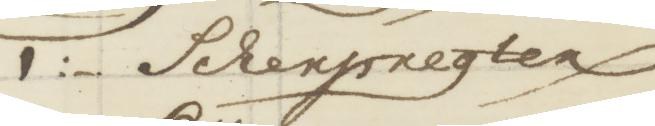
1:–. scherpregter
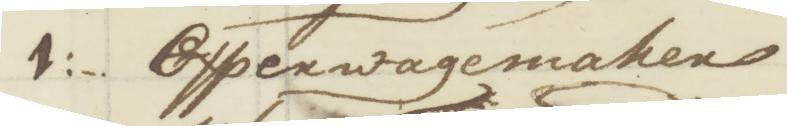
1:–. Opperwagemaker
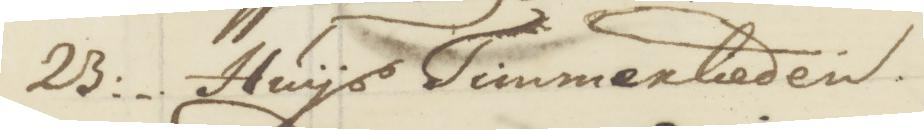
23:-. Huijs Timmerlieden.
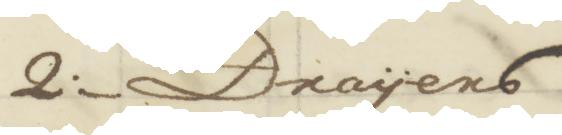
2:–. Draijers
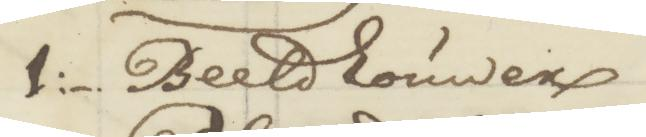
1:–. Beeldhouwer
